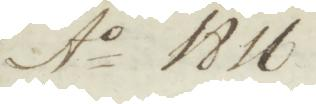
A=o 1816
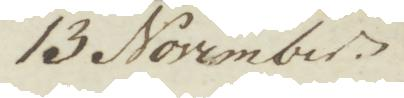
13 November.
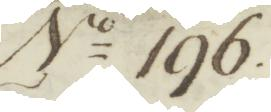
N=o 196.
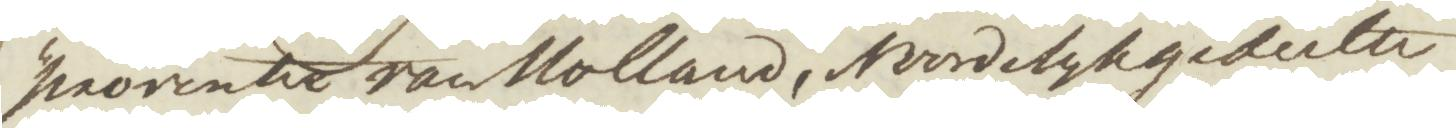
provintie van Holland, Noordelykgedeelte
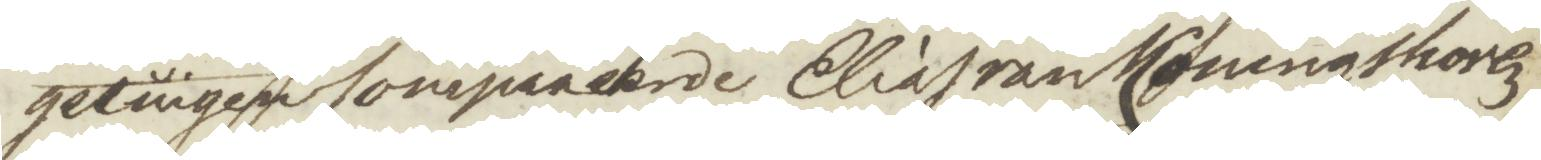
getuigen Compereerde Elias van Koningshoven
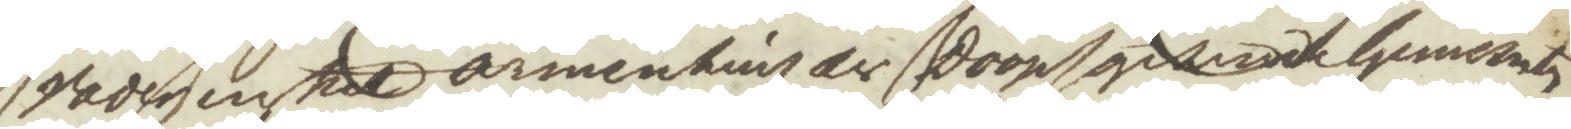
vader in het armenhuis der Doopsgezinde Gemeente
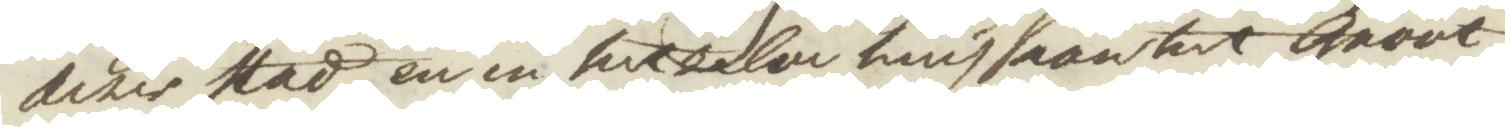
dezer stad, en in hetzelve huis aan tot groot
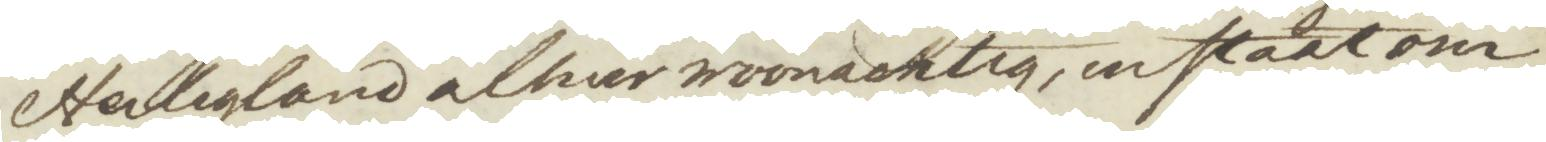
Heiligland alhier woonachtig, in staat om
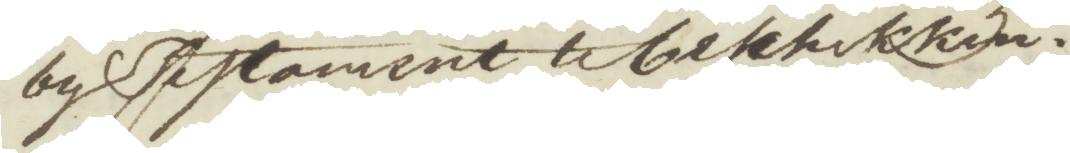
by Testament te beschikken.
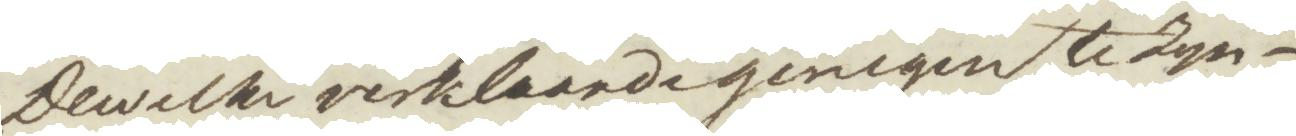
Dewelke verklaarde genegen te zyn
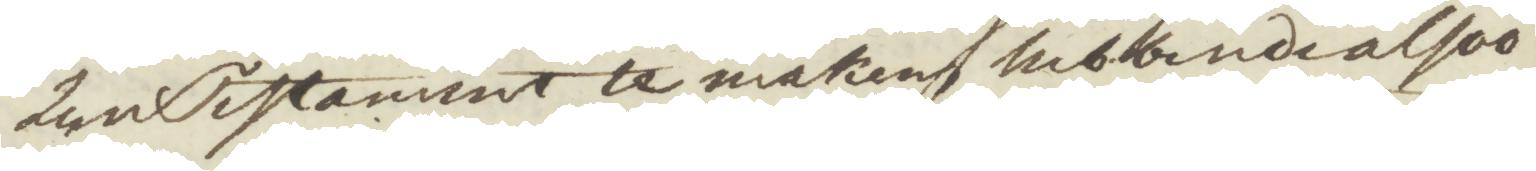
zyn Testament te maken, hebbende alsoo
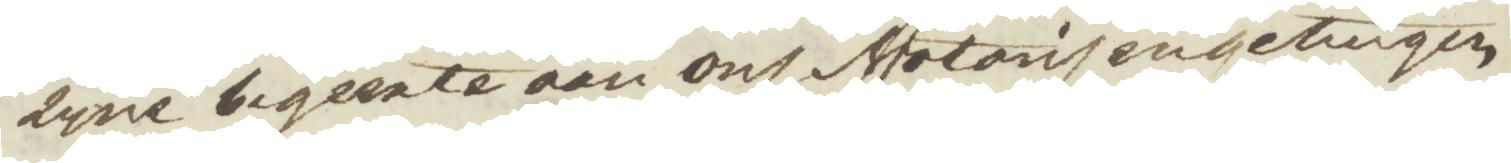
zyne begeerte aan ons Notaris en getuigen
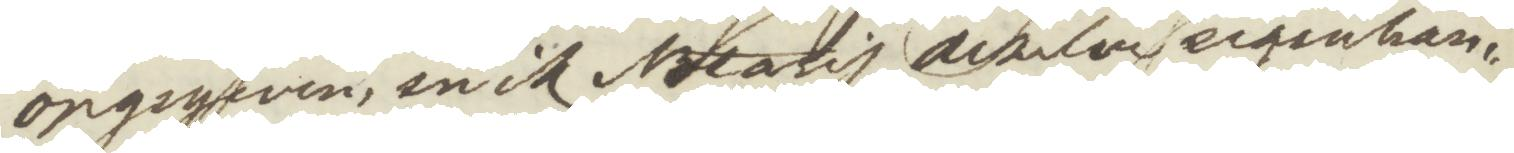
opgegeven, en ik Notaris dezelve eigenhan„
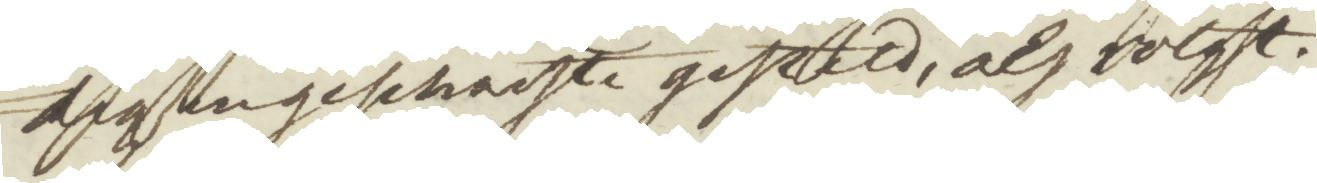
=dig in geschrifte gesteld, als volgt.
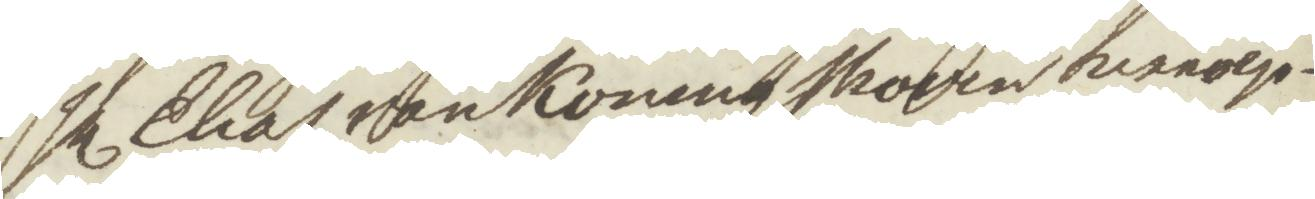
Jk Elias van Koningshoven herroep
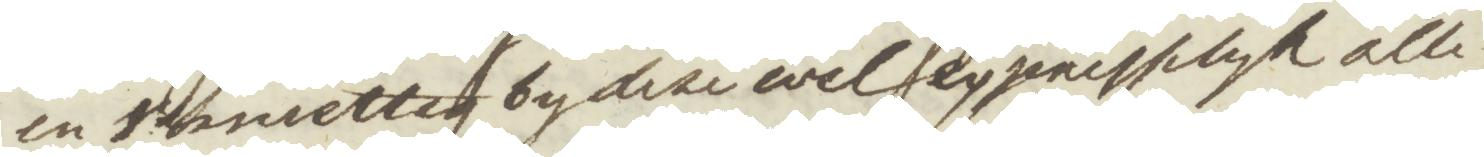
en verniettig by deze wel expressivelyk alle
